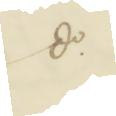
d.o
